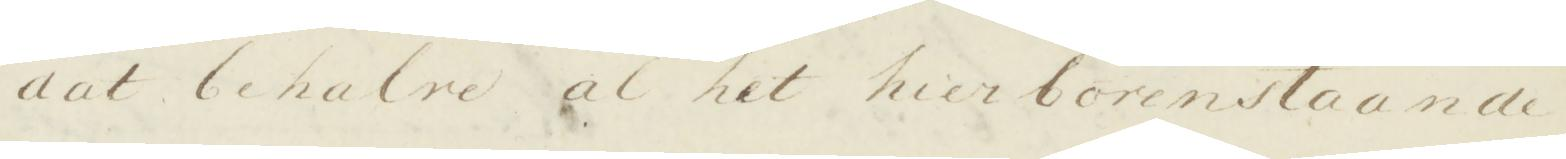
dat behalve al het hier bovenstaande
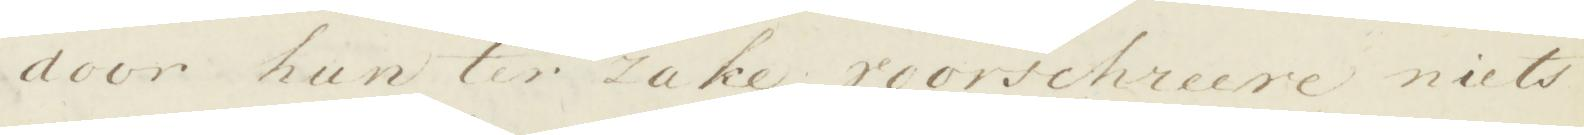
door hun ter zake voorschreeve niets
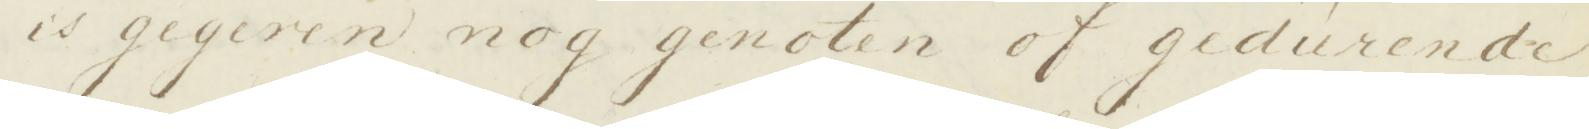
is gegeven nog genoten of gedurende
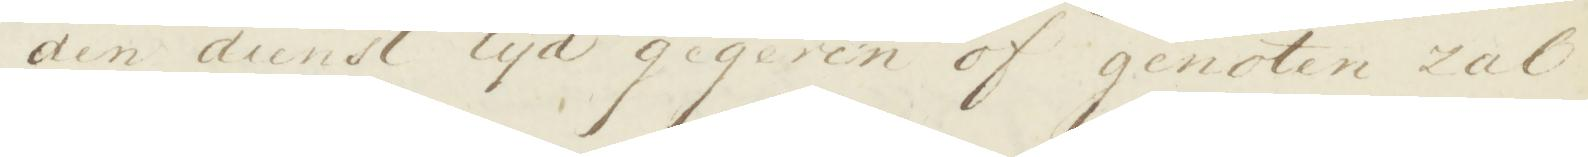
den dienst tyd gegeven of genoten zal
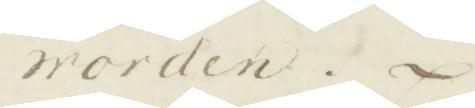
worden. —
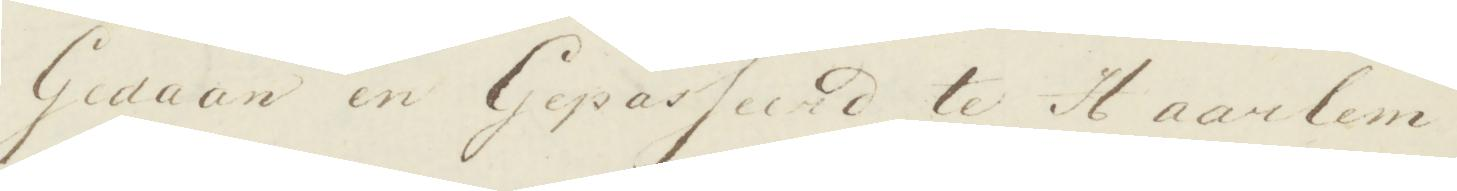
Gedaan en Gepasseerd te Haarlem
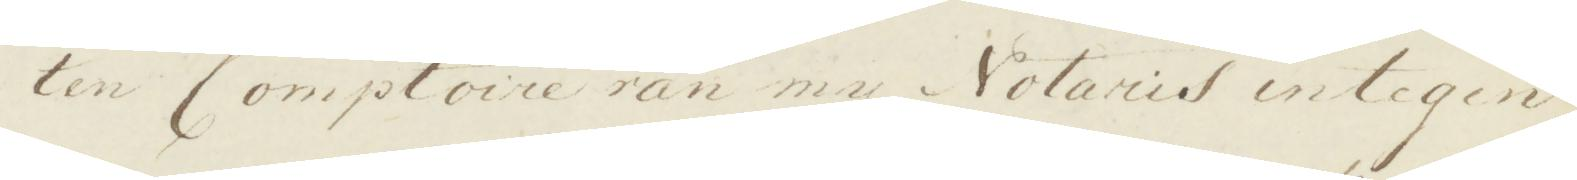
ten Comptoire van mij, Notaris in tegen
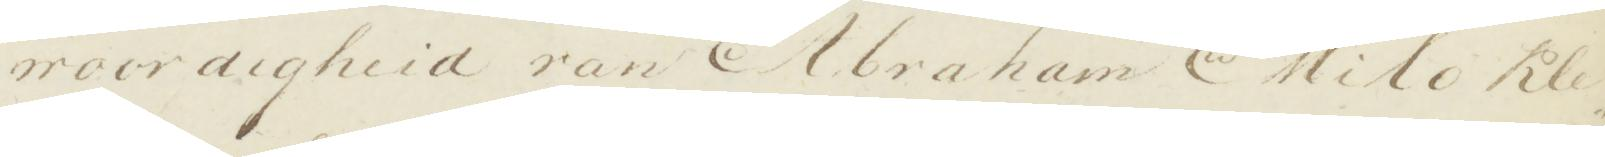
woordigheid van Abraham Milo kle„
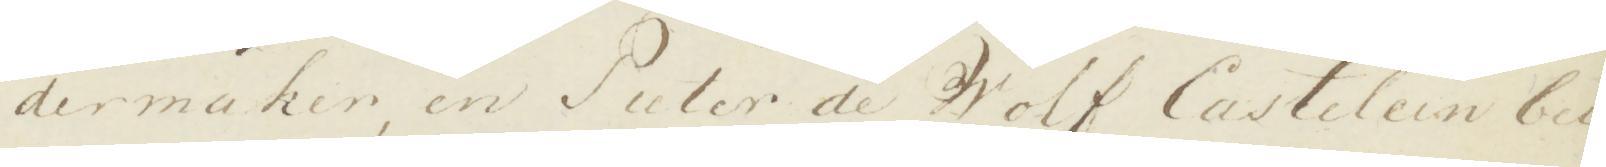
dermaker, en Pieter de Wolf Castelein bei
